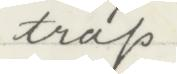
trap
